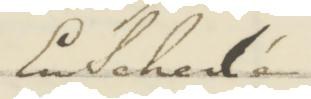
Enschedé
